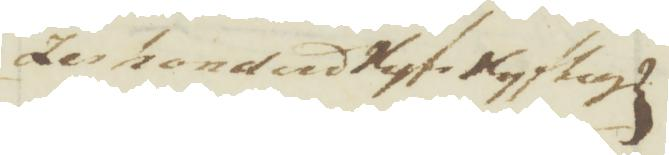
zes honderd Vyf & vyftig
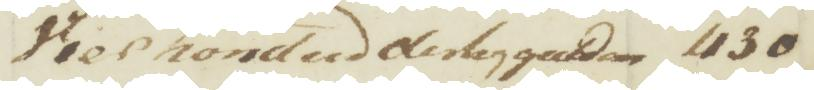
Vier honderd dertig gulden 430
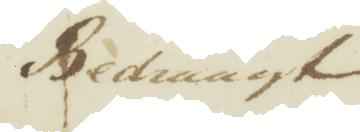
Bedraagt
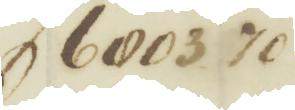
ƒ 6803 70
